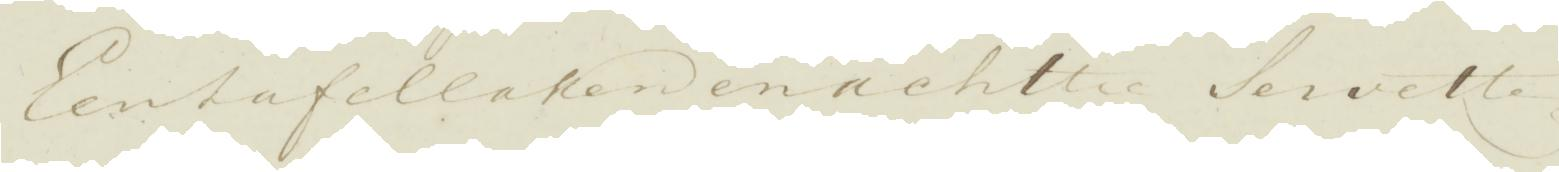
Een tafellaken en achttien servetten
